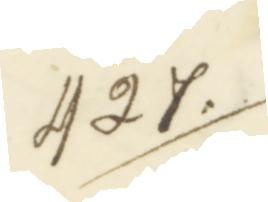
427.
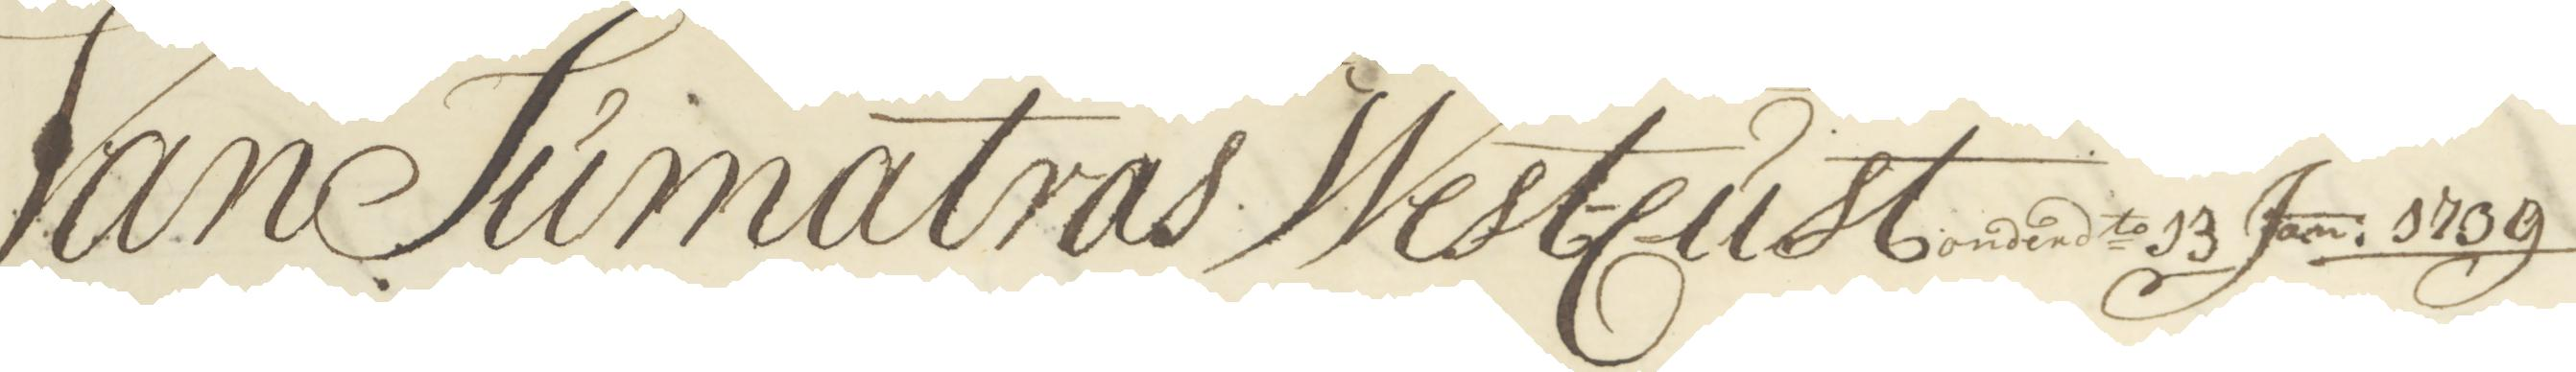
Van Sumatras Westcust onder d=to 13 Jan: 1739
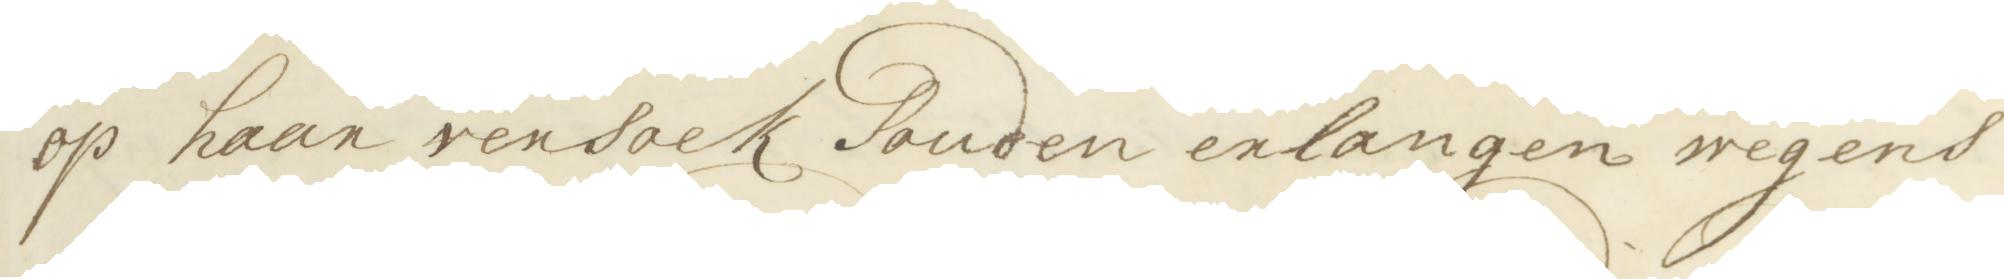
op haar versoek souden erlangen wegens
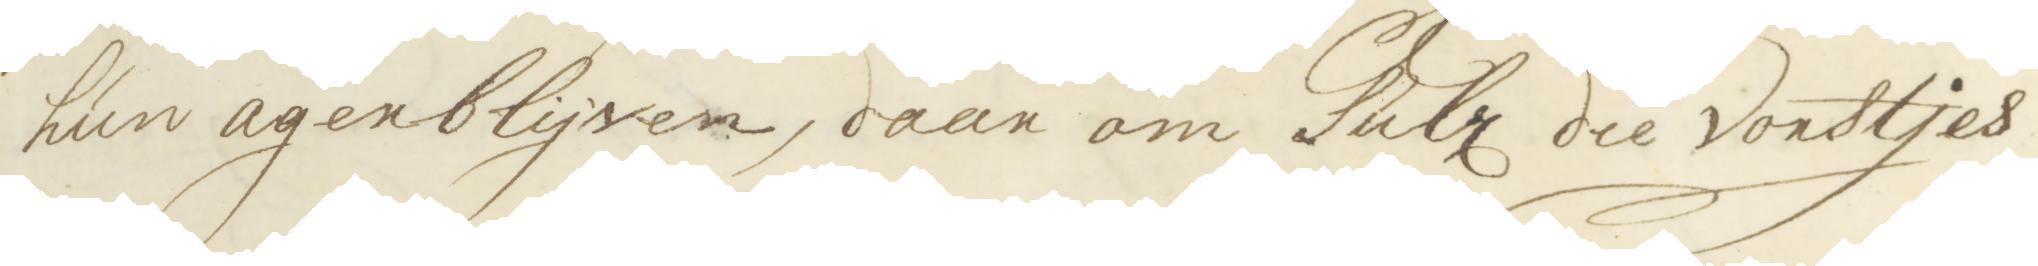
hun agerblijven, daar om sulx die vorstjes
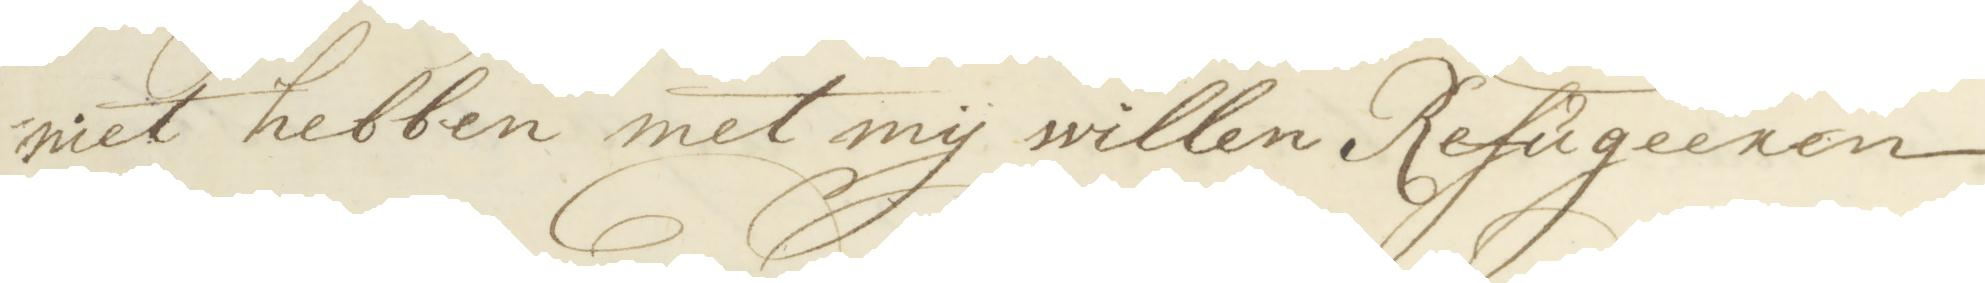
niet hebben met mij willen Refugeeren
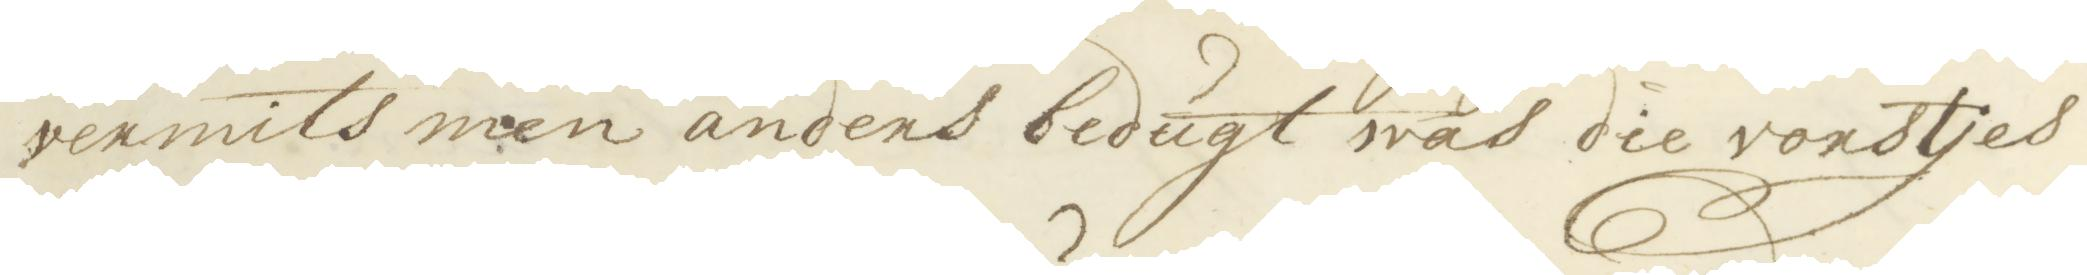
vermits men anders bedugt was die vorstjes
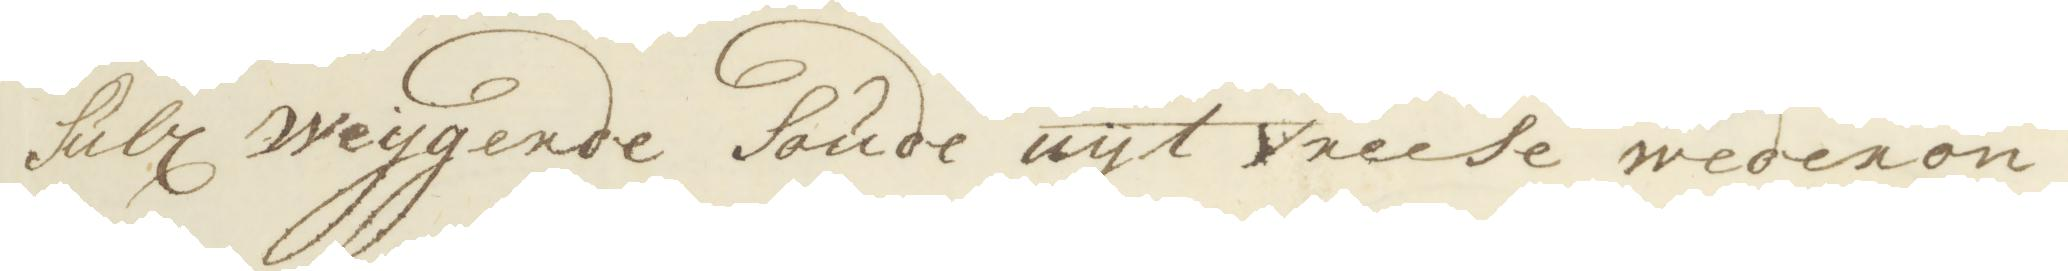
sulx weijgerde soude uijt vreese wederon
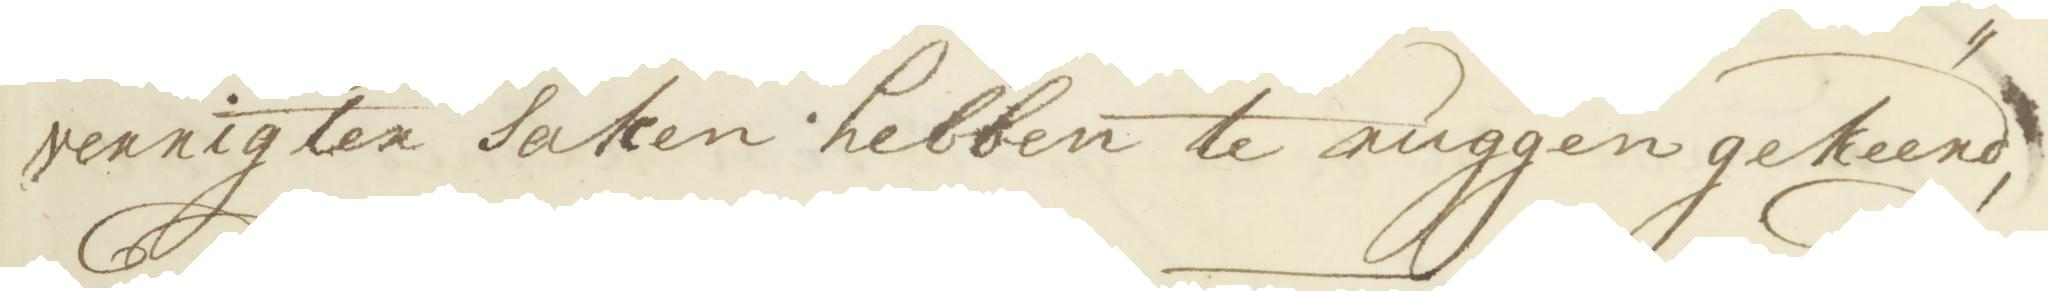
verrigter saken hebben te ruggen gekeerd,
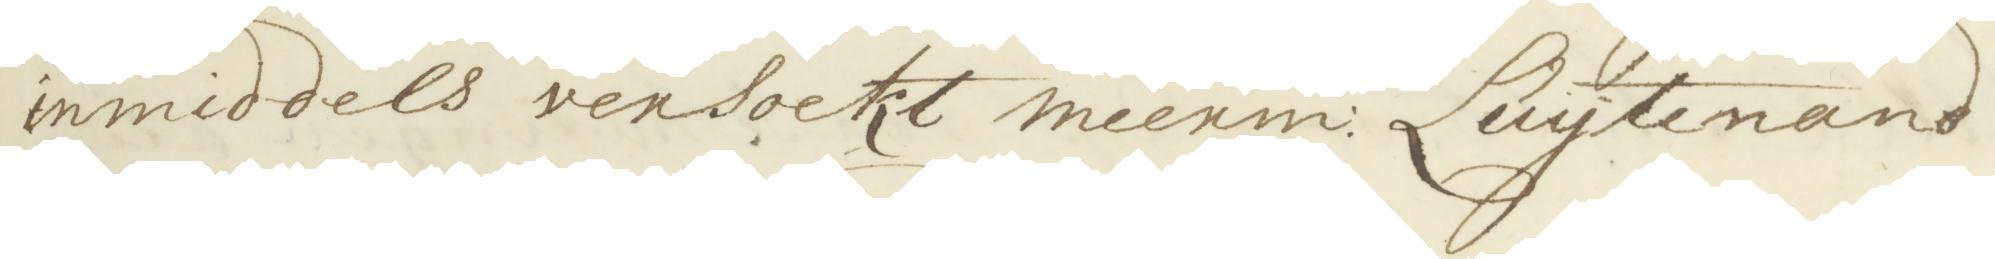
inmiddels versoekt meerm: Luijtenand
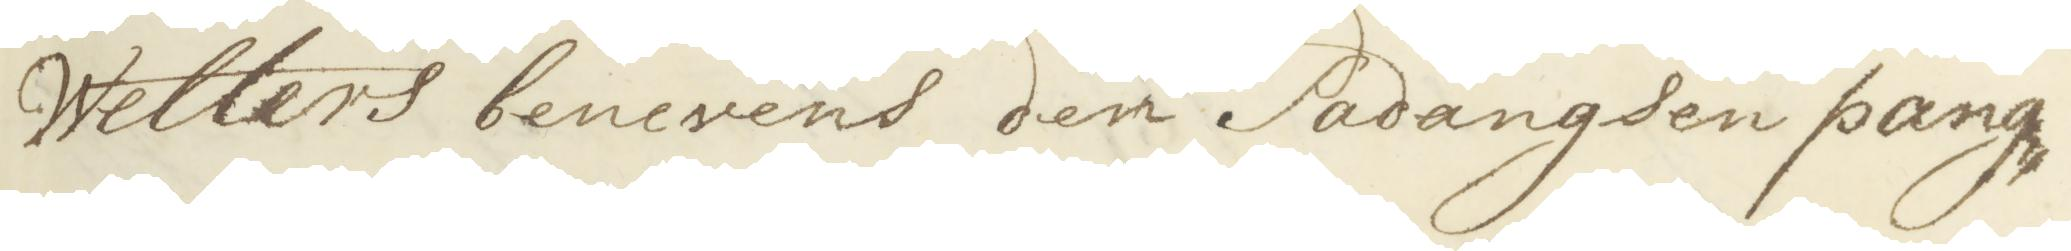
Welters benevens den Padangsen pang„
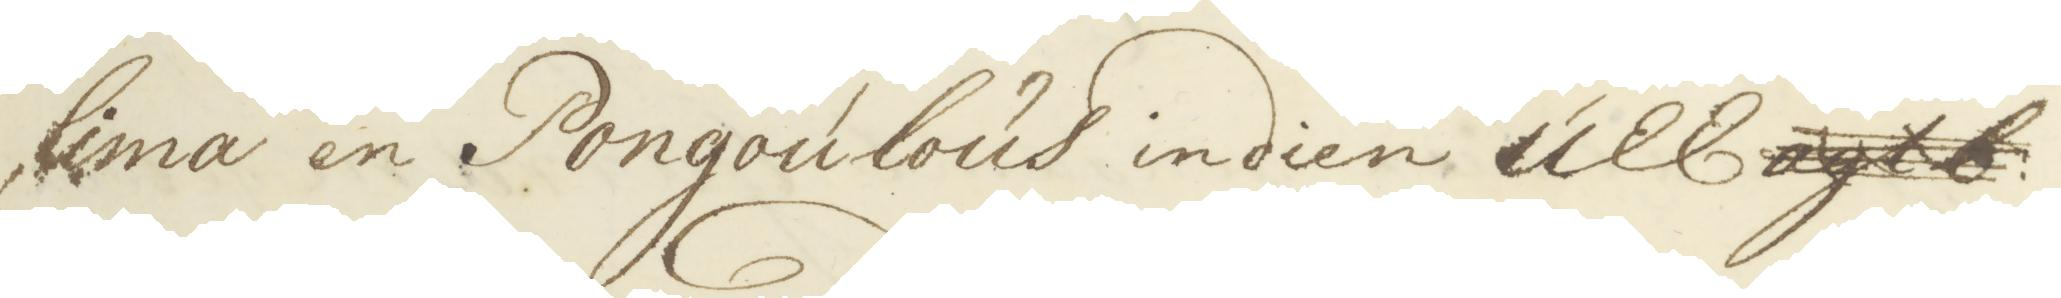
„lima en Pongoulous in dien UEE agtb:
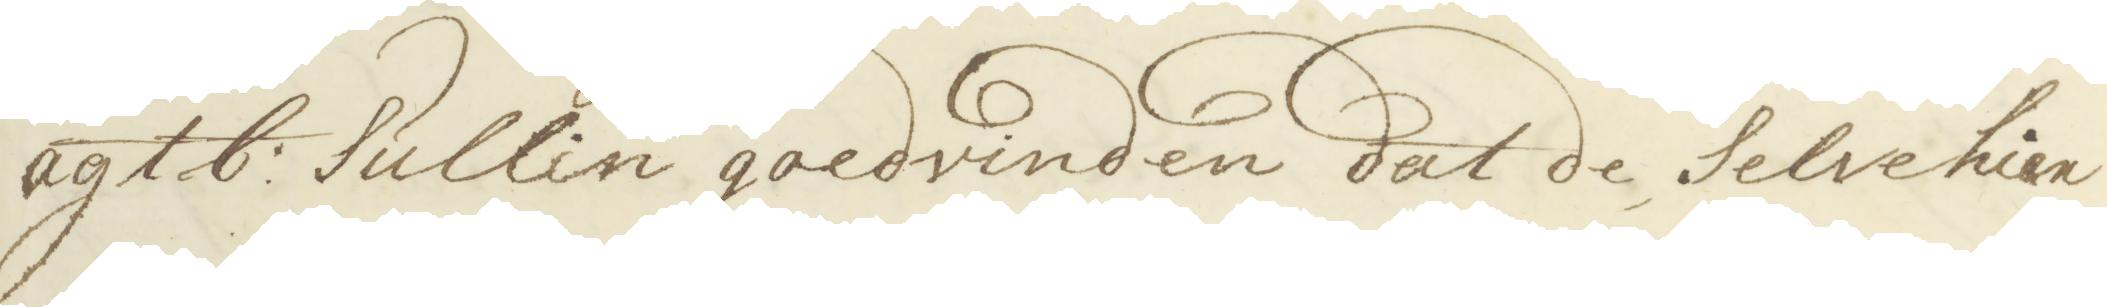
agtb: sullen goedvinden dat de, selve hier
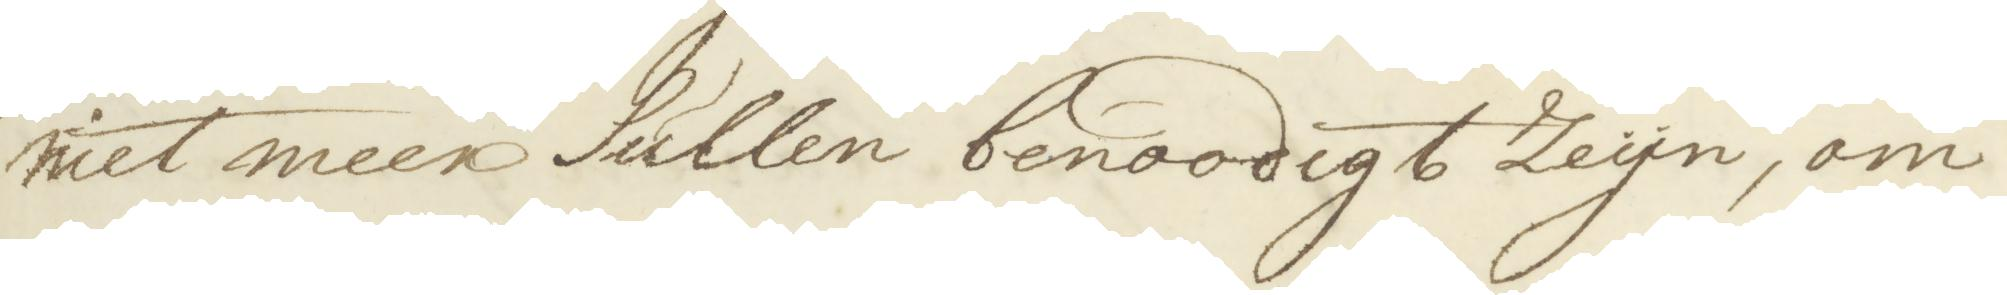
niet meer sullen benoodigt zeijn, om
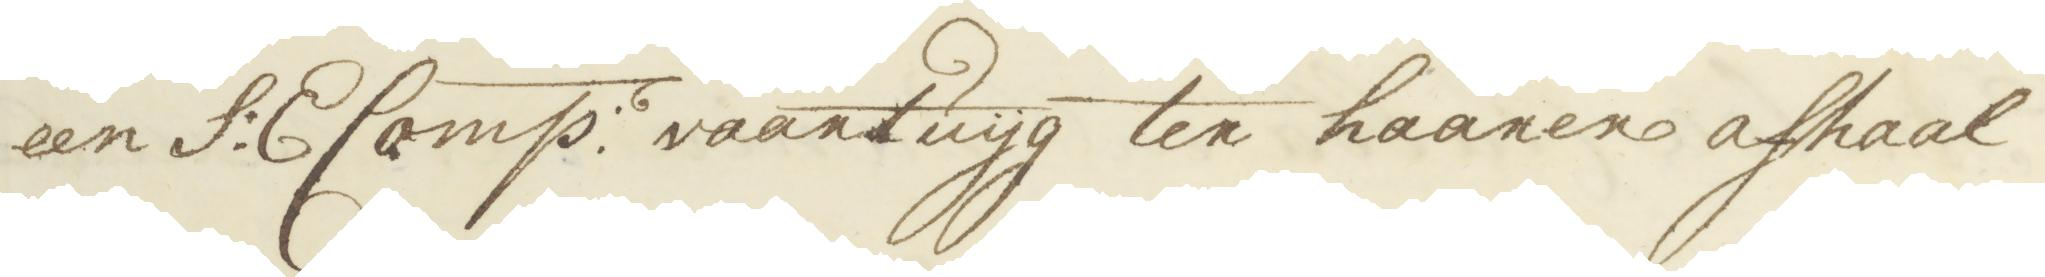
een s: E Comp:s vaartuijg ter haarer afhaal
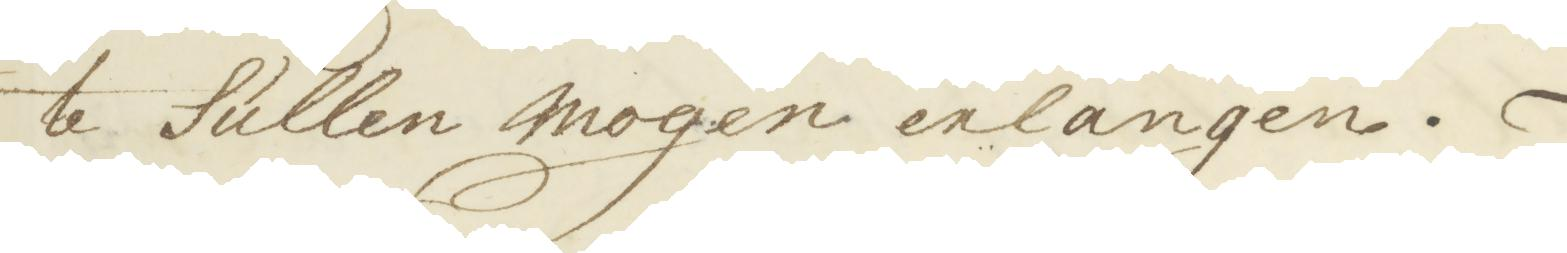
te sullen mogen erlangen.
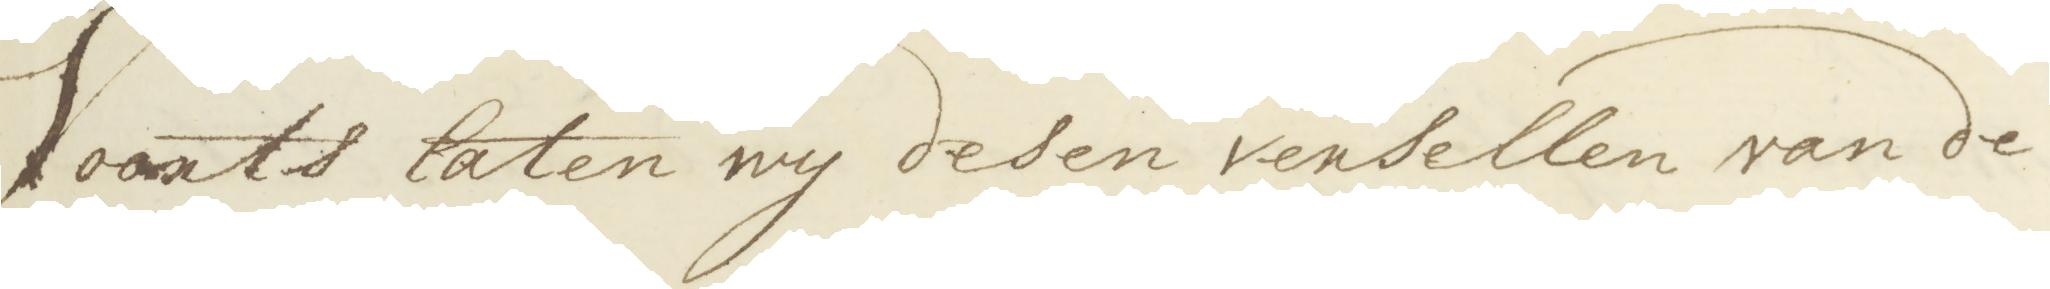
Voorts laten wy desen versellen van de
